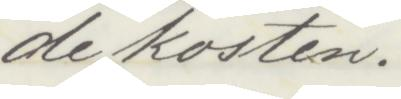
de kosten.
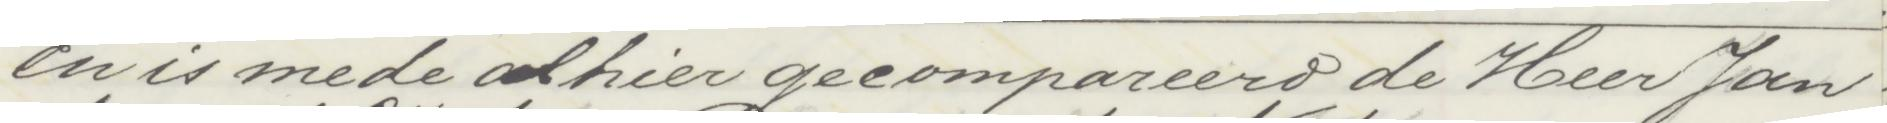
En is mede alhier gecompareerd de Heer Jan
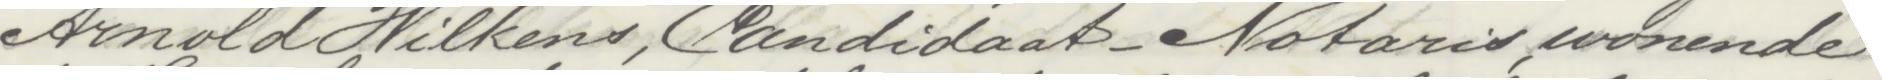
Arnold Wilkens, Candidaat-Notaris, wonende
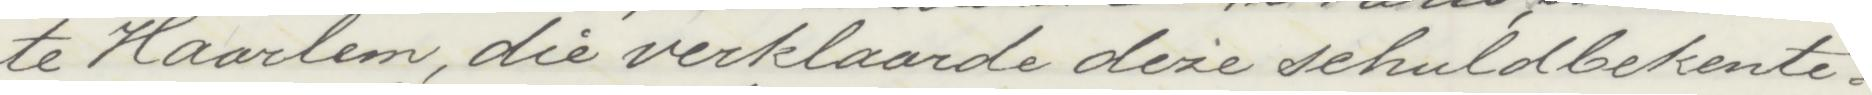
te Haarlem, die verklaarde deze schuldbekente=
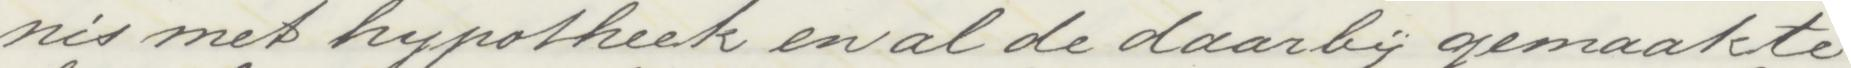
nis met hypotheek en al de daarbij gemaakte
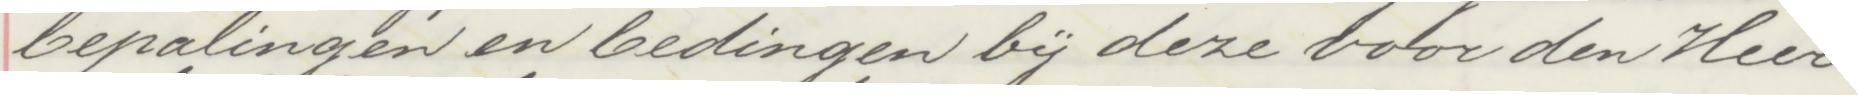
bepalingen en bedingen bij deze voor den Heer
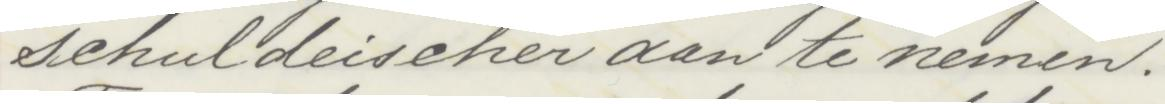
schuldeischer aan te nemen.
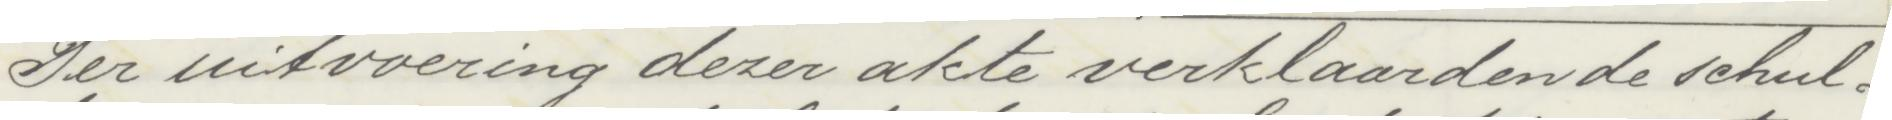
Der uitvoering dezer akte verklaarden de schul=
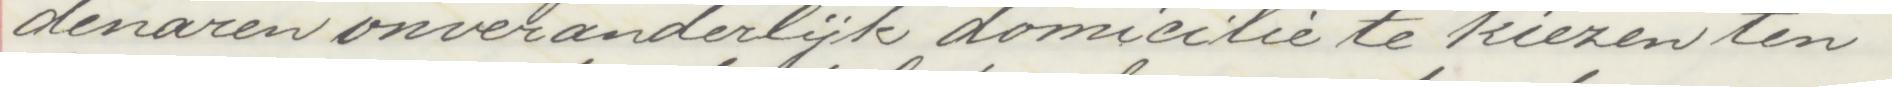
denaren onveranderlijk domicilie te kiezen ten
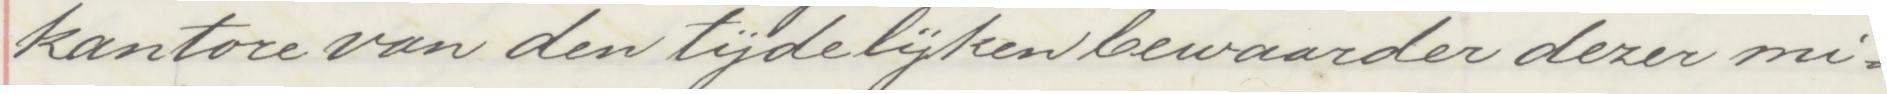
kantore van den tijdelijken bewaarder dezer mi=
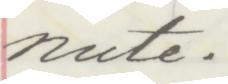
nute.
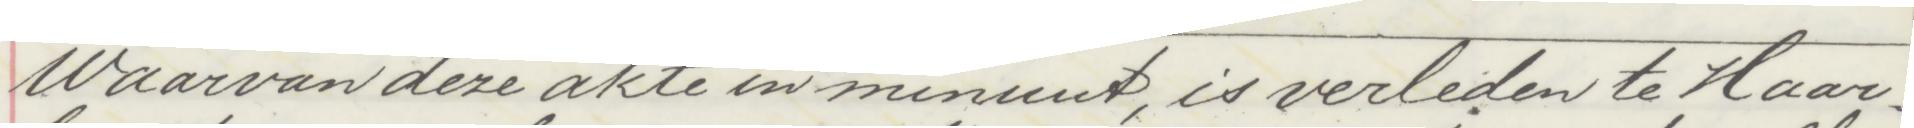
Waarvan deze akte in minuut, is verleden te Haar=
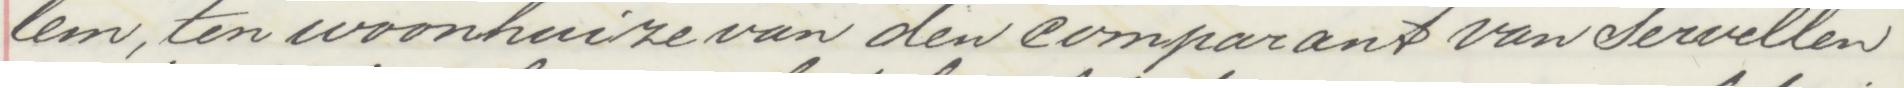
lem, ten woonhuize van den comparant van Servellen
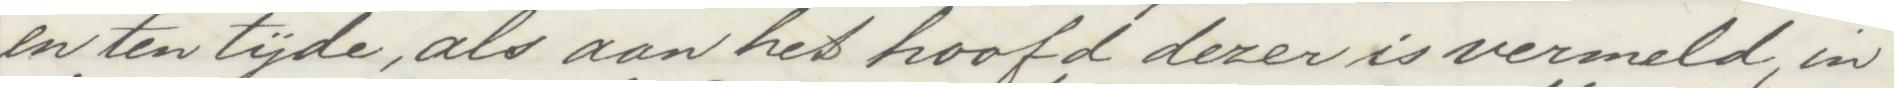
en ten tijde, als aan het hoofd dezer is vermeld, in
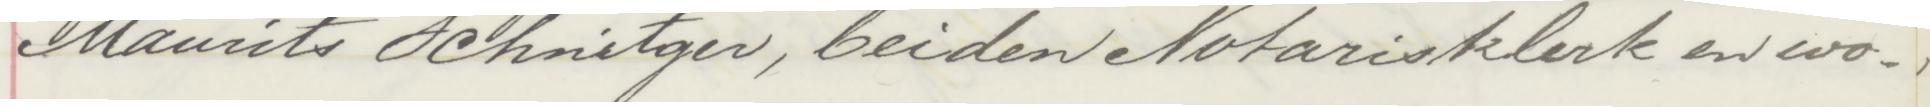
Maurits Schnitger, beiden Notarisklerk en wo=
